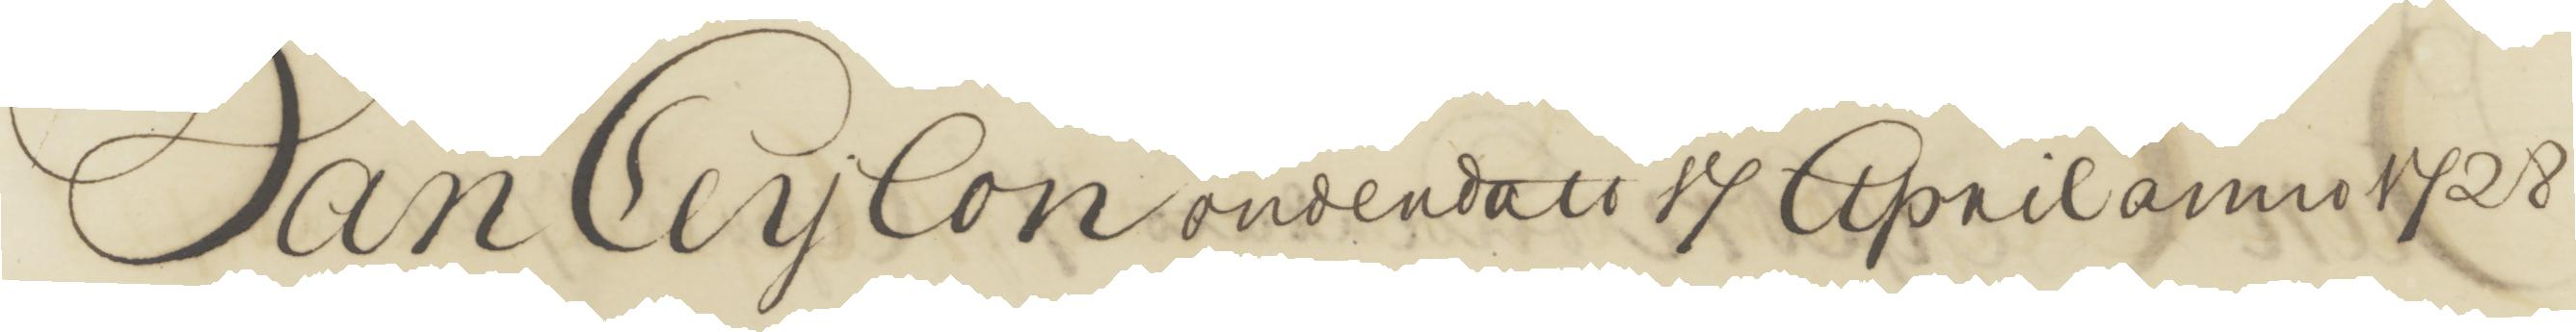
Van Ceijlon onderdato 17 April anno 1728
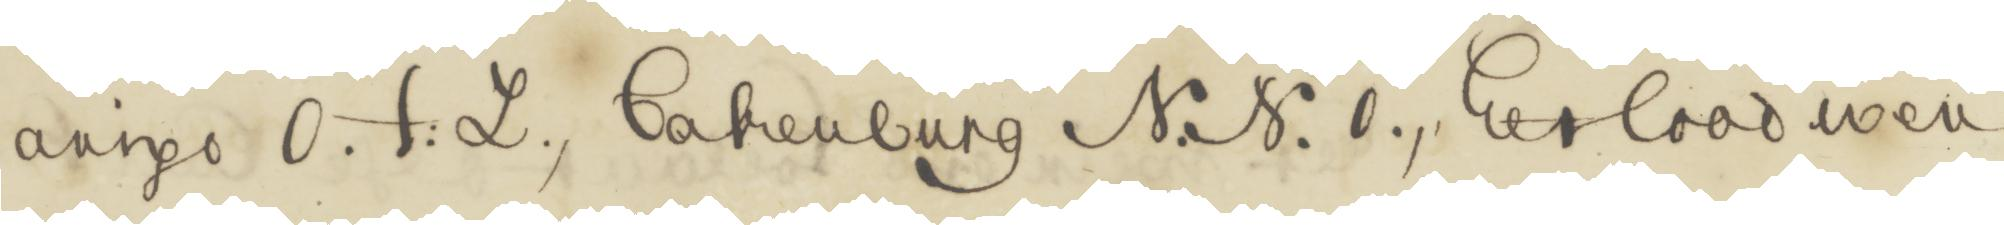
aripo O. t: Z., bakenburg N. N. O.,, het lood wer
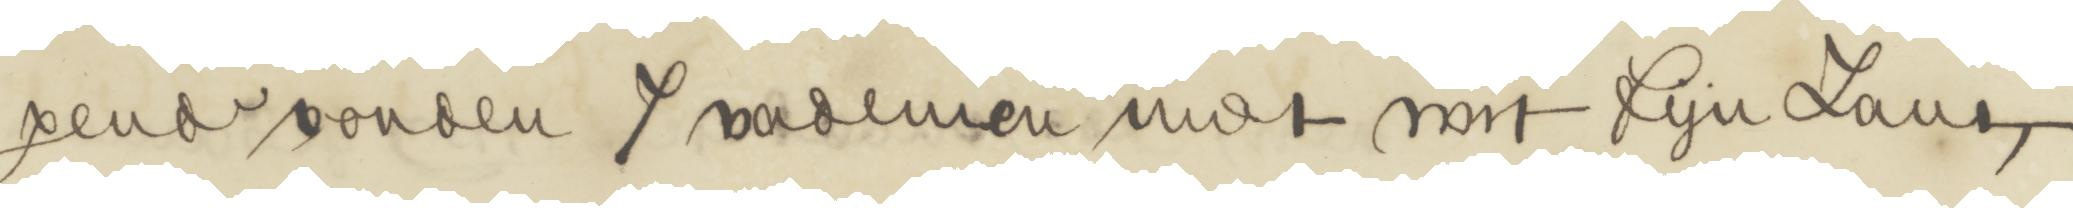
pende vonden 7 vademen met wit fijn Zant,
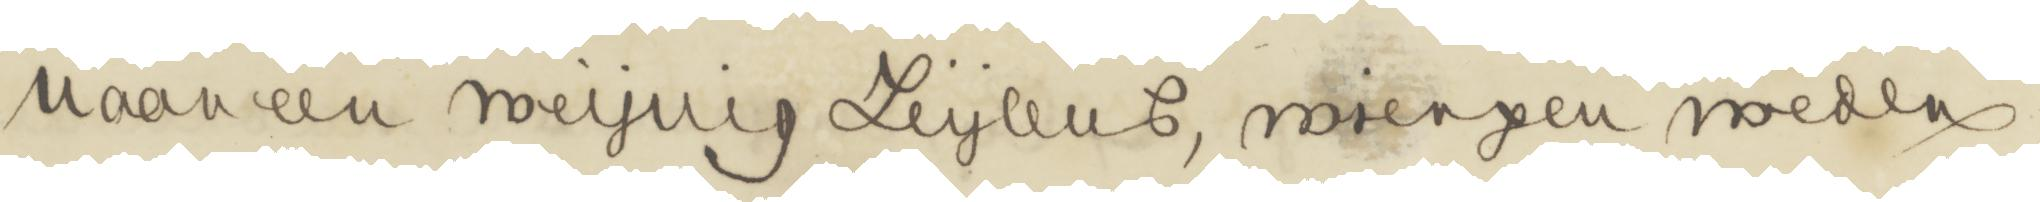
naar een weijnig Zeijlens, wierpen weder
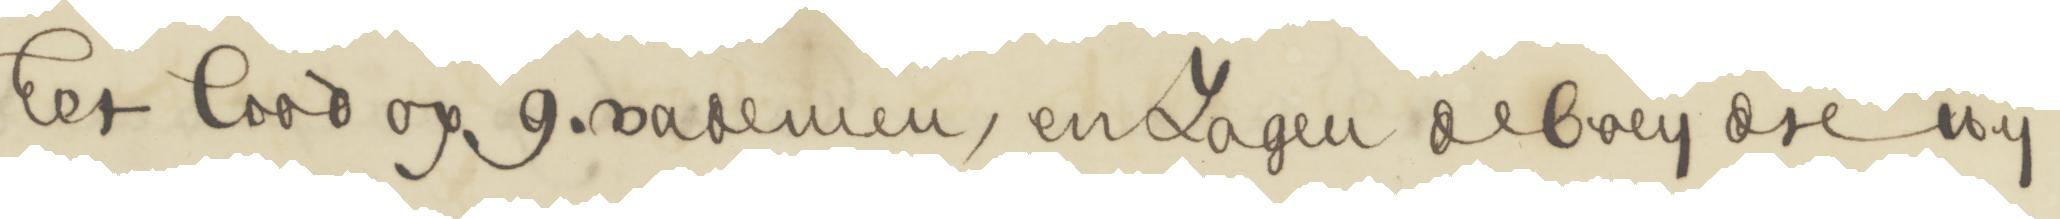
het lood op 9. vademen, en Zagen deboeij die wij
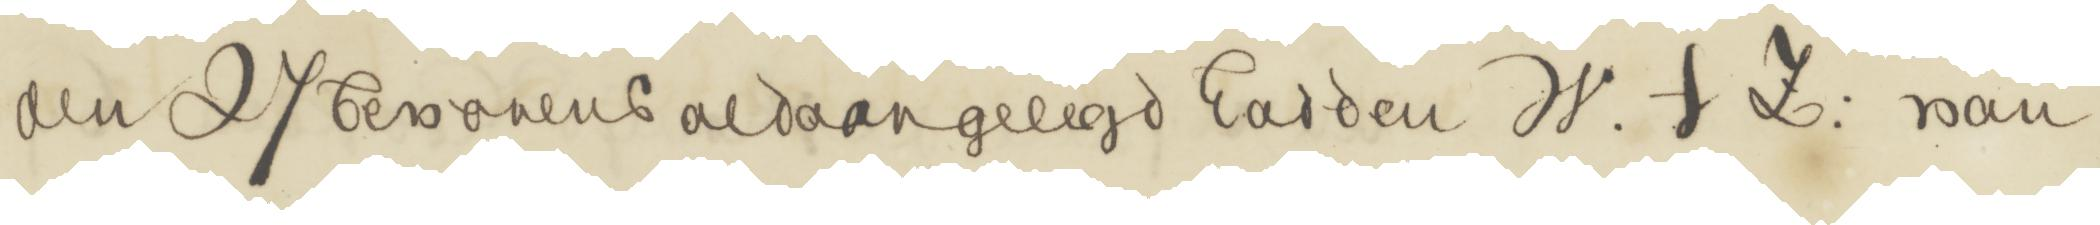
den 27 bevorens aldaar gelegd hadden W. t Z: van
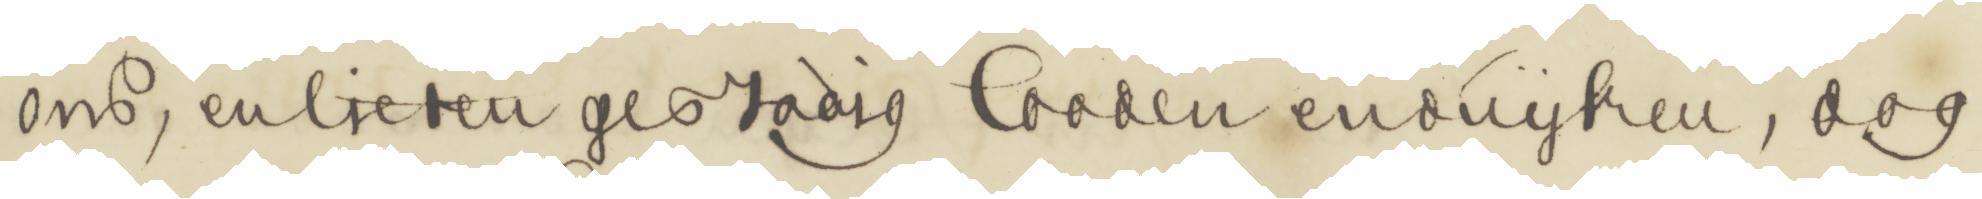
ons, en lieten gestadig looden en duijken, dog
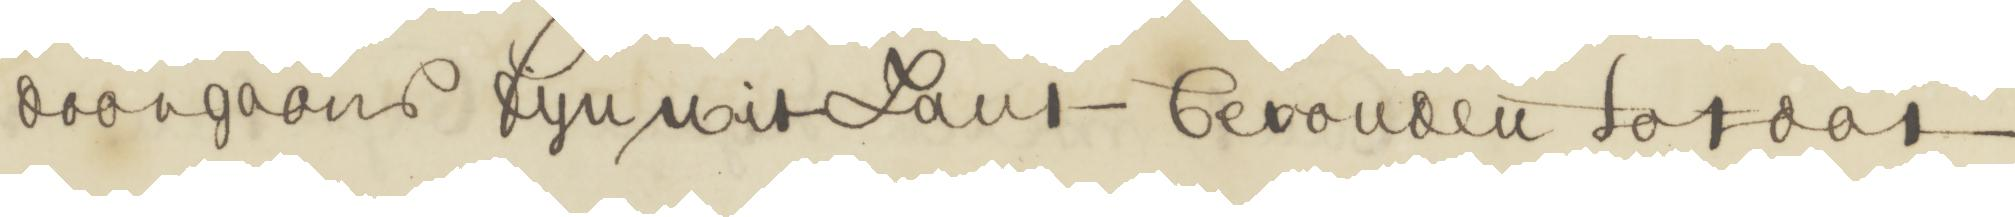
doorgaans fijn wit Zant bevonden tot dat
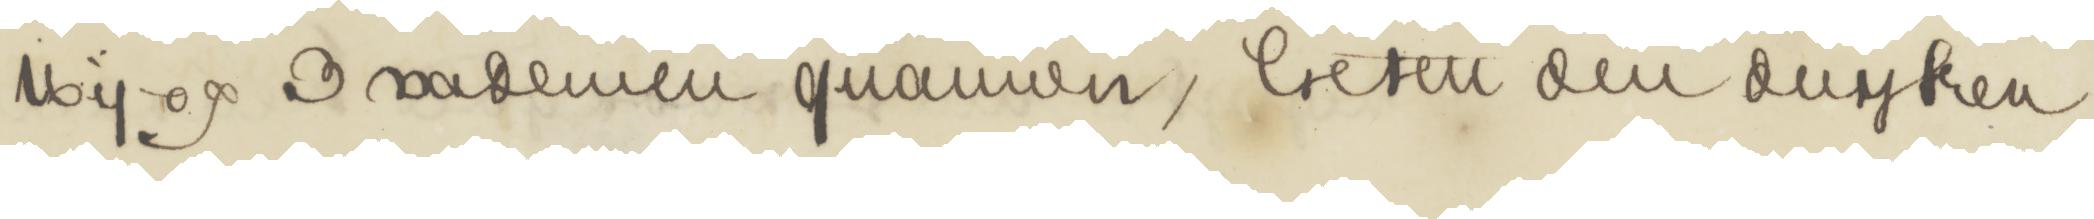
wij op 3 vademen quamen, lieten den duijker
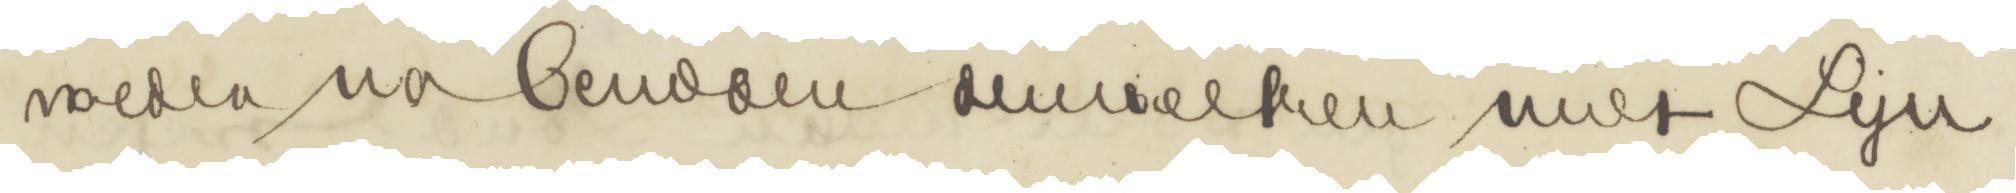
weder na beneden denwelken met zijn
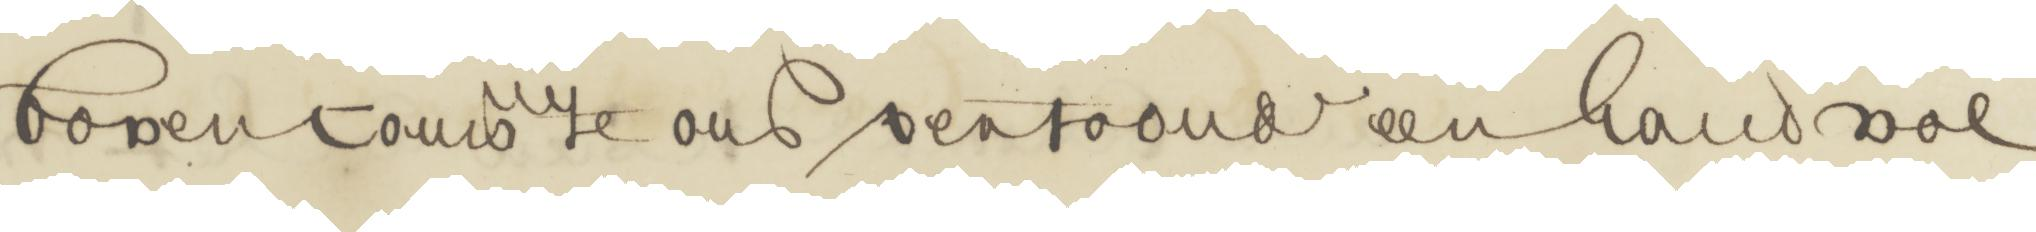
boven comste ons vertoonde een hand vol
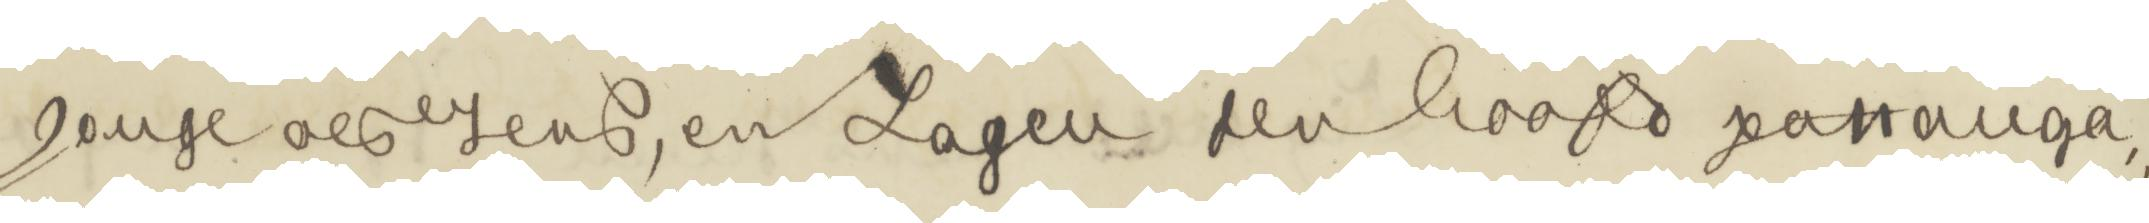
jonge oesters, en Zagen den hoofd pattanga„
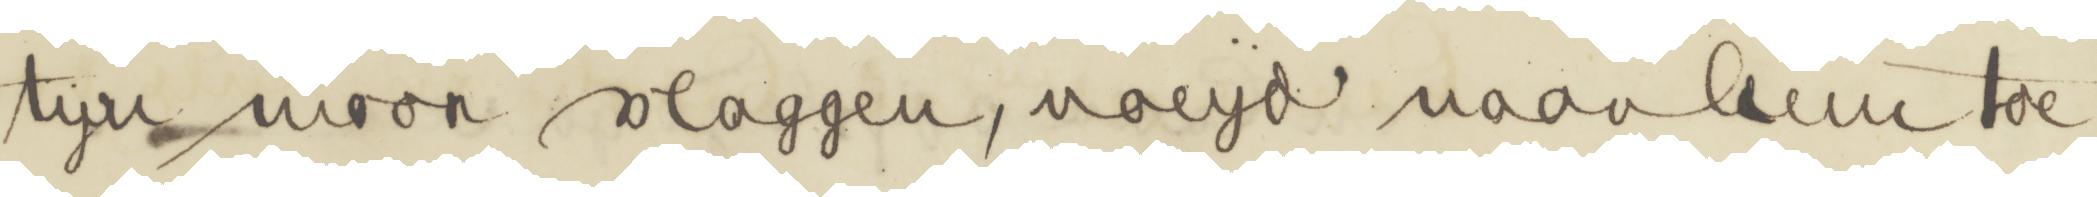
tijn moor vlaggen, roeijd naar hem toe
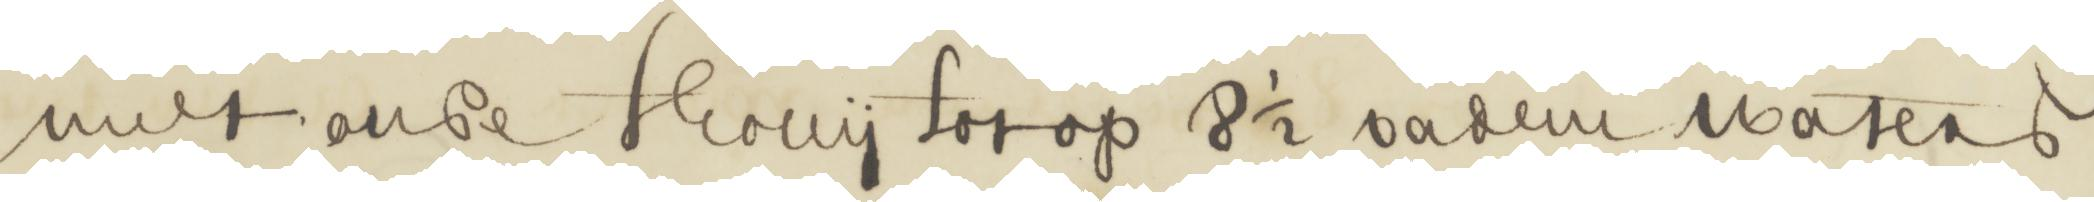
met onse thonij tot op 8½ vadem waters
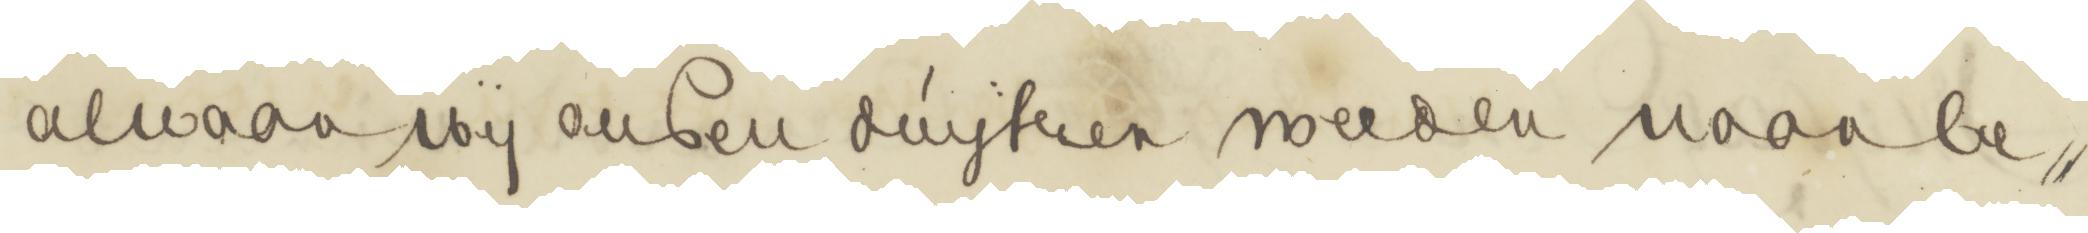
alwaar wij onsen duijker weeder naar be„
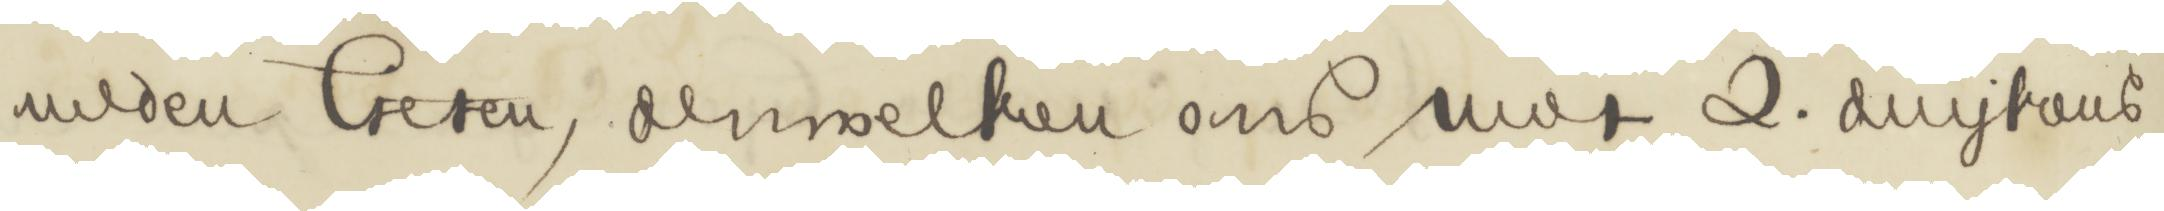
neden lieten, denwelken ons met 2. duijkers
